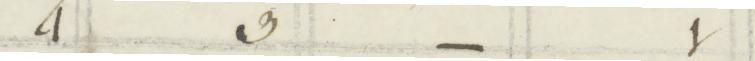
4 3 — 1
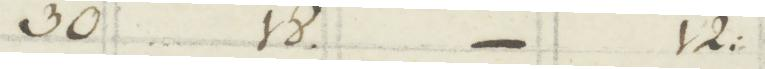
30 18. — 12:
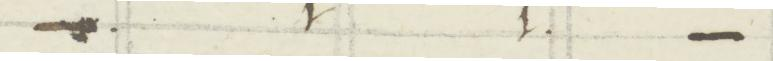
—. 1 1. —
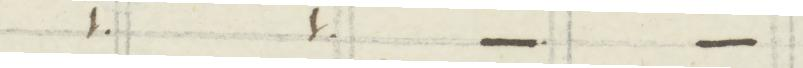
1. 1. —. —
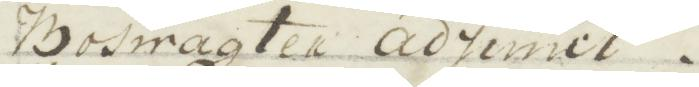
Boswagter adjunct
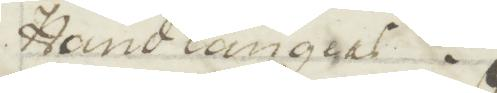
Handlangers .
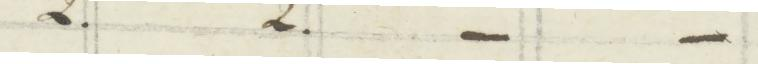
2. 2. — —
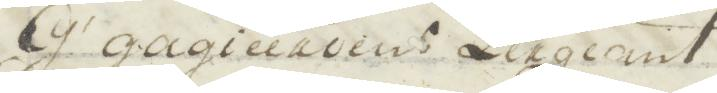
G' gagieerdens Zergeant
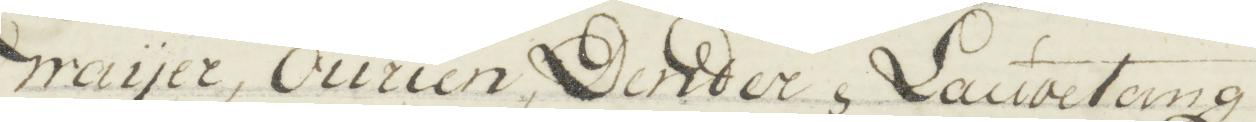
waijer, Ourien, Dender en Lauoetang
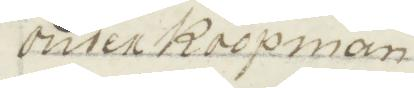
onder koopman
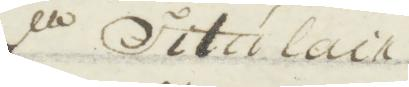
_o Titulair
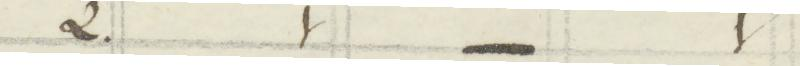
2. 1 — 1
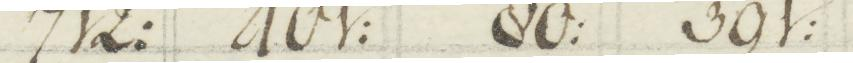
712: 401: 80: 391:
